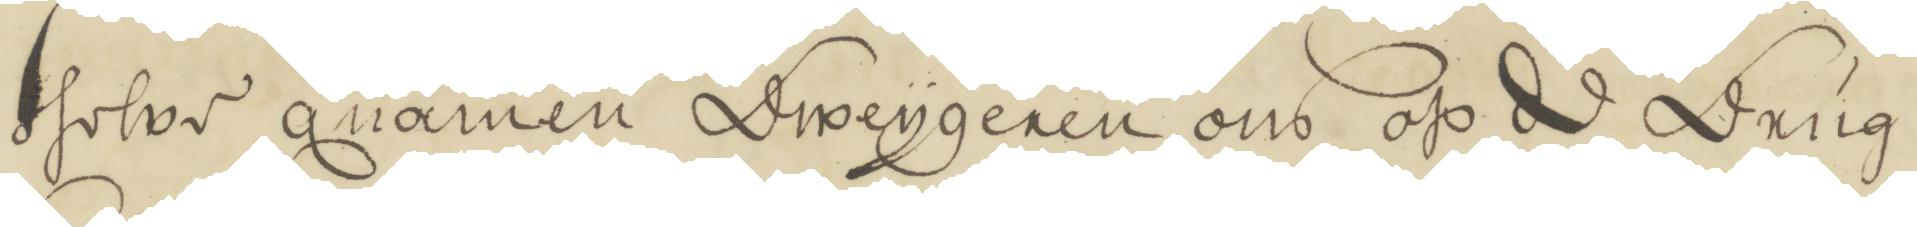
t selve quamen te weijgeren, ons op de terug
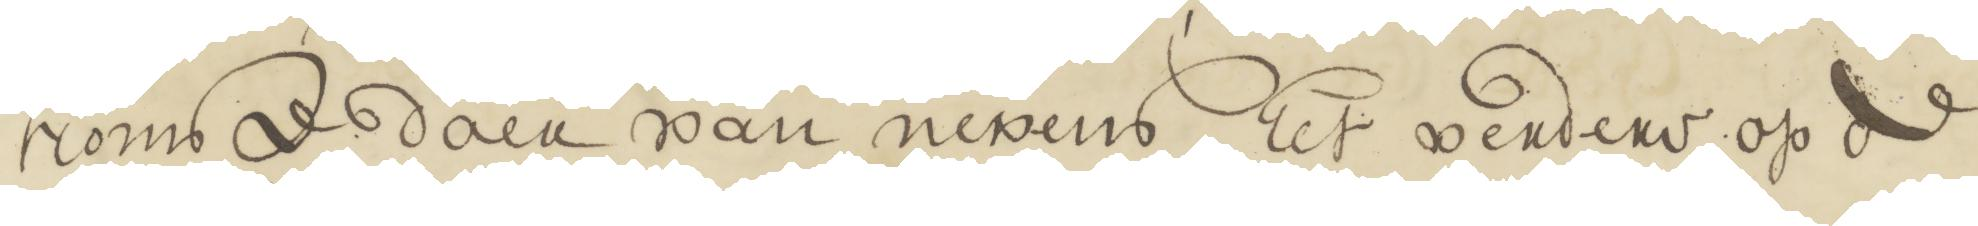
komste daer van nevens het verdere op de
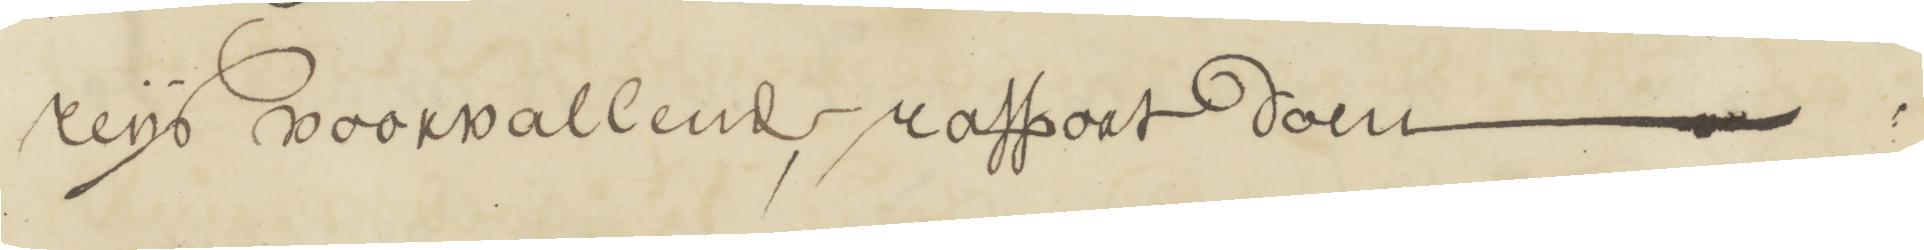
reijs voorvallende, rapport doen.
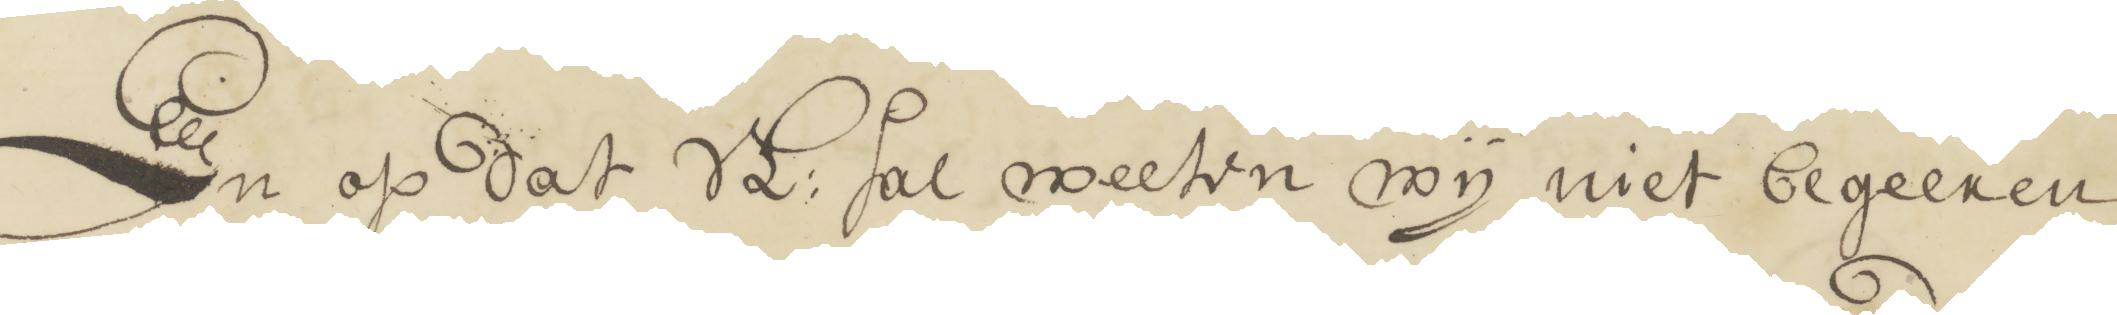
En op dat VE: Sal weeten wij niet begeeren
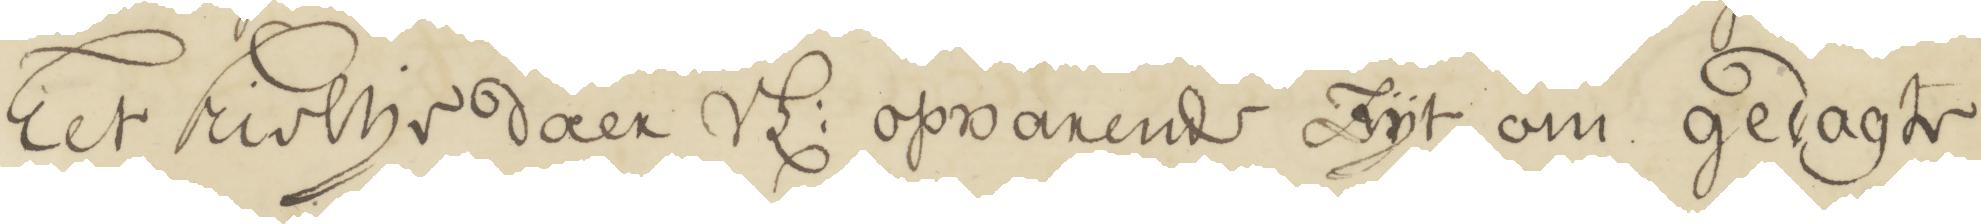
het kieltje daer VE: opvarende Zijt, om gedagte
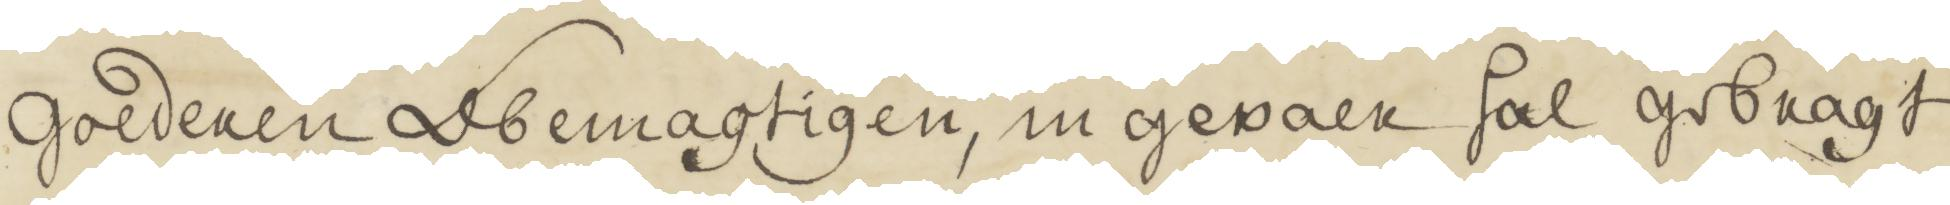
goederen te bemagtigen, in gevaer Sal gebragt
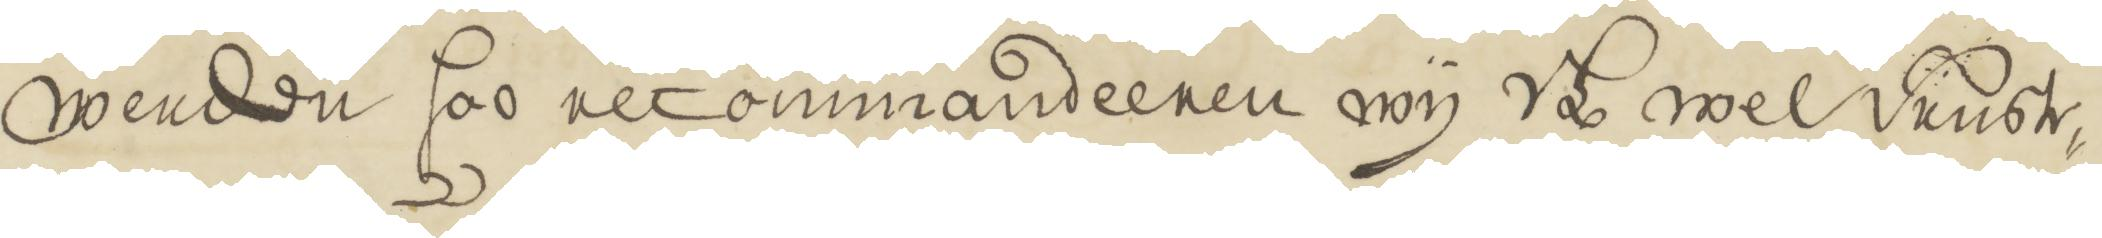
werden Soo recommandeeren wij VE wel Ernst„
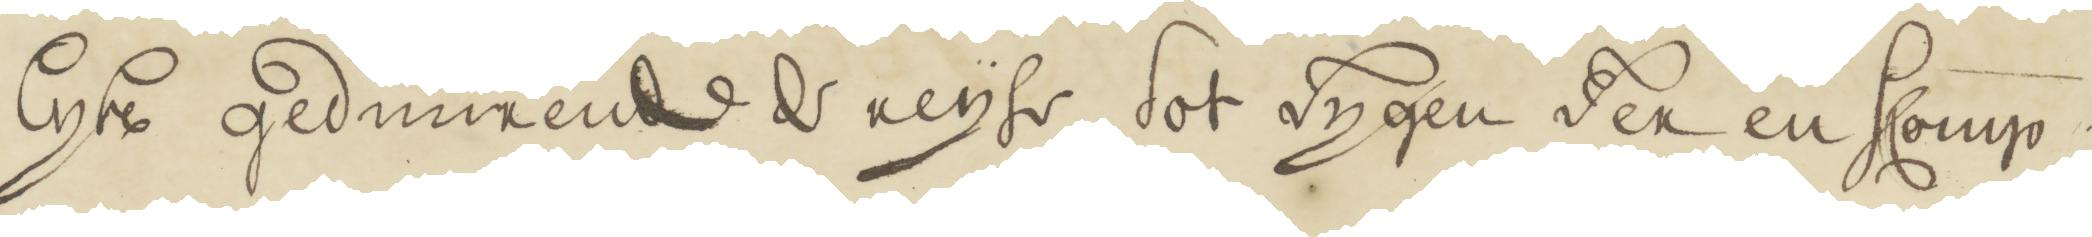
lyk geduurende de reijse tot Eygen Eer en SComp:
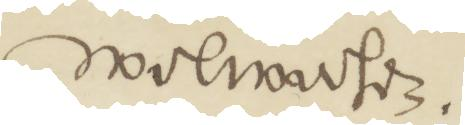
welweesen.
